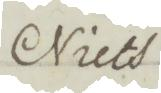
Niets
